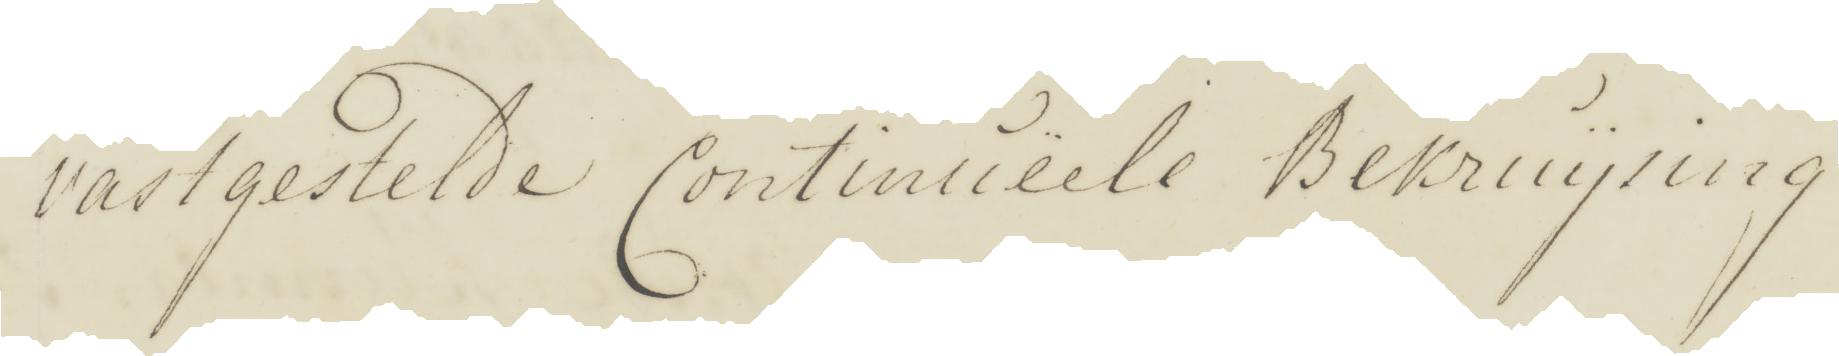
vast gestelde Continuëele Bekruijsing
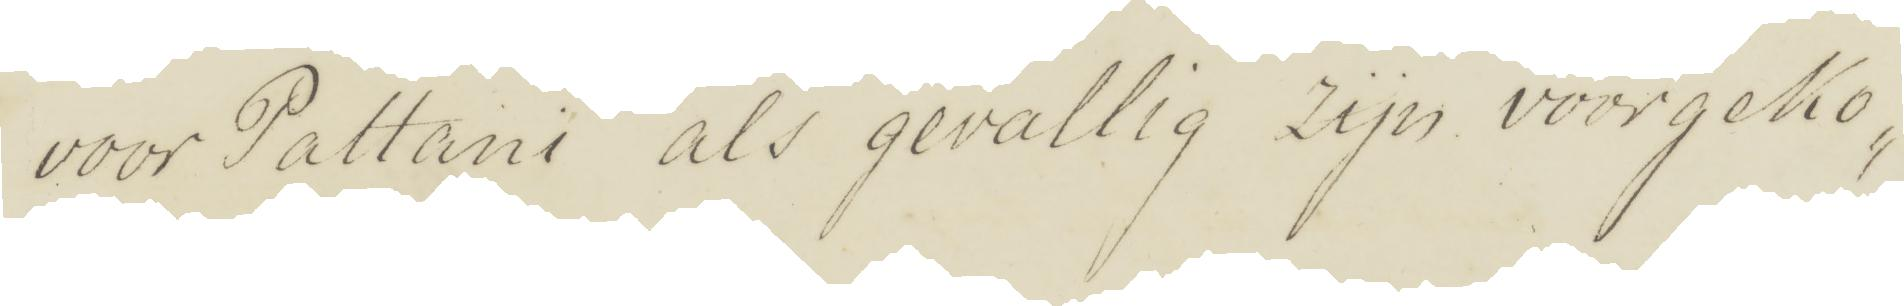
voor Pattani als gevallig zijn voorgeko„
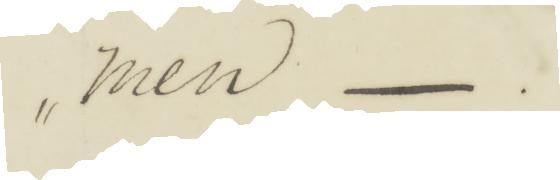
„men — .
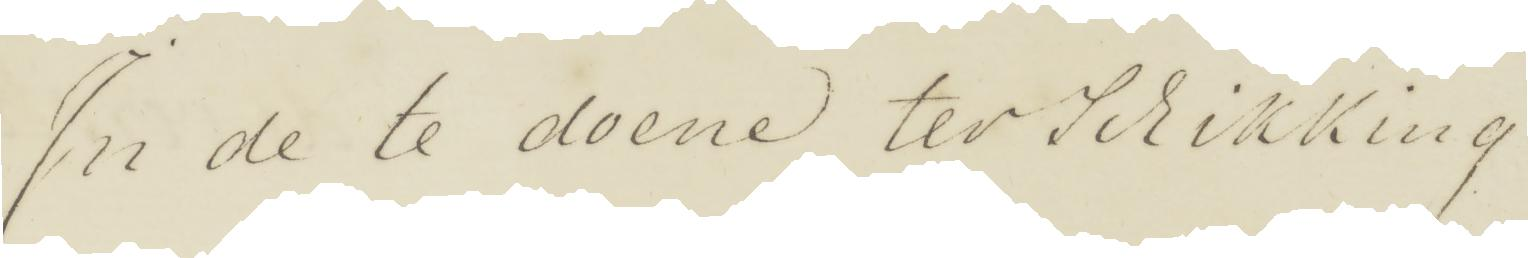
Jn de te doene ter schikking
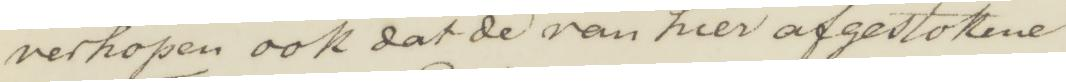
verhopen ook dat de van hier afgestokene
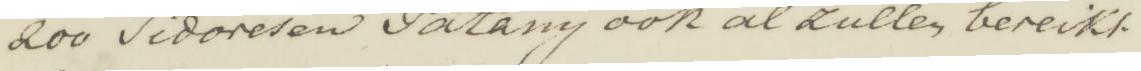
200 Tidoresen Patany ook al zullen bereikt
